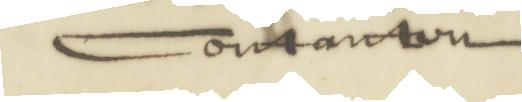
contanten
